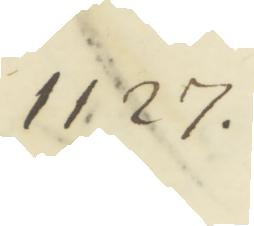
1127.
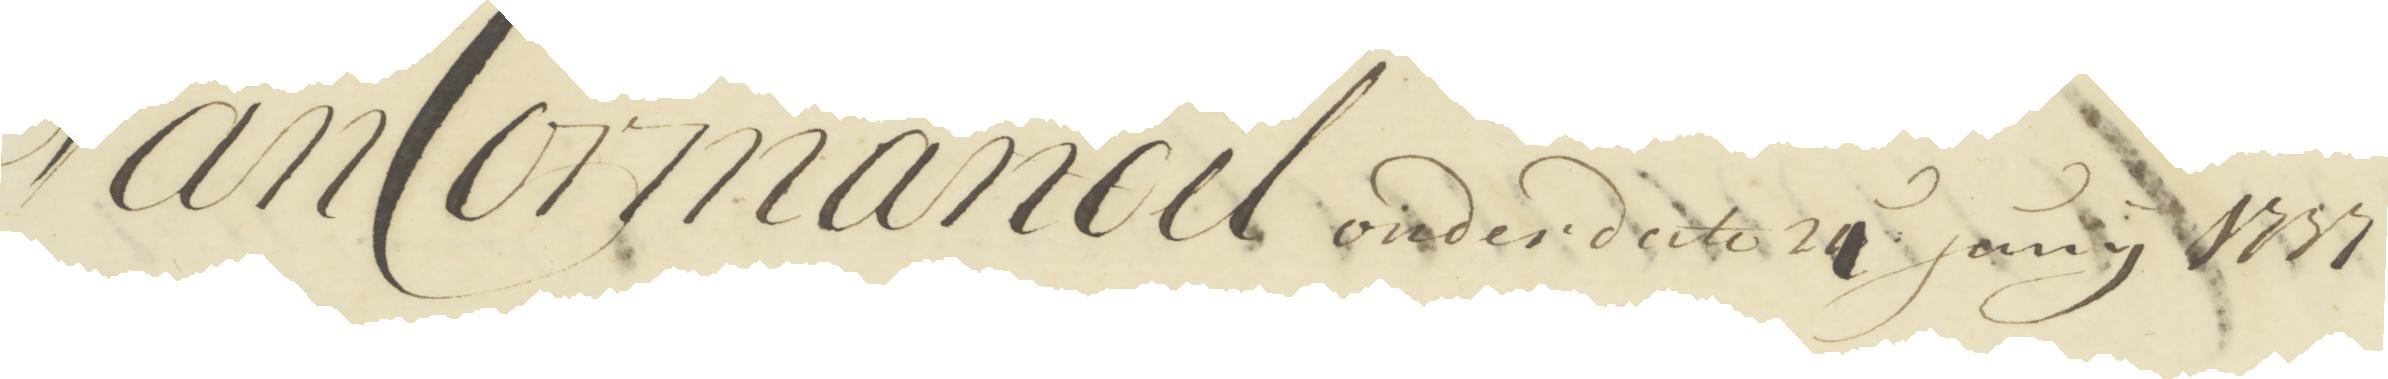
Van Cormandel onder dato 24:' junij 1737
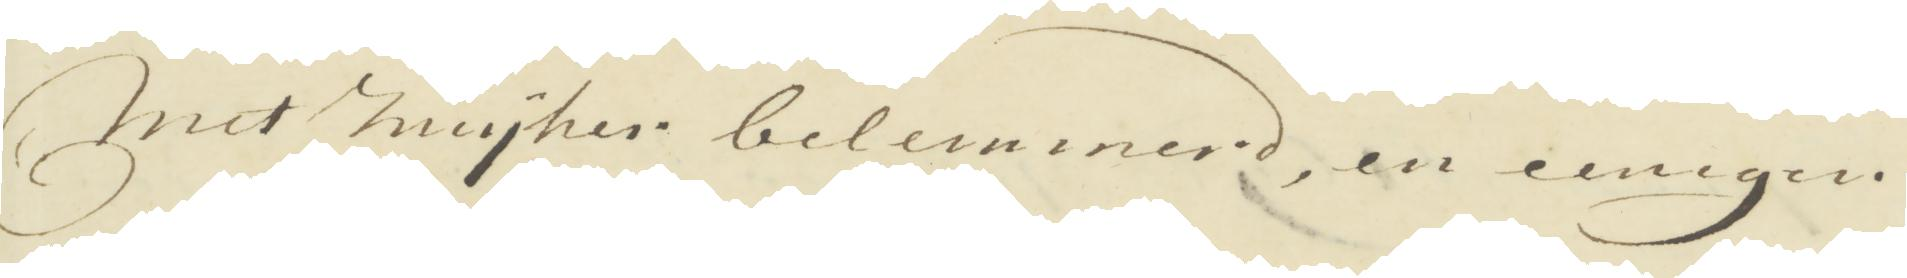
met zuijker belemmerd, en eenigen
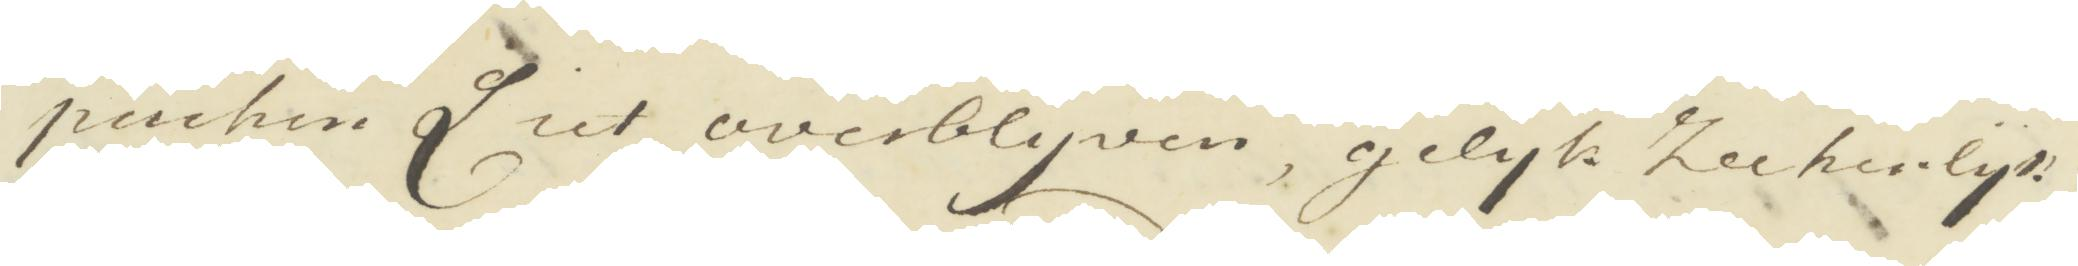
packen Liet overblijven, gelyk zeekerlijk
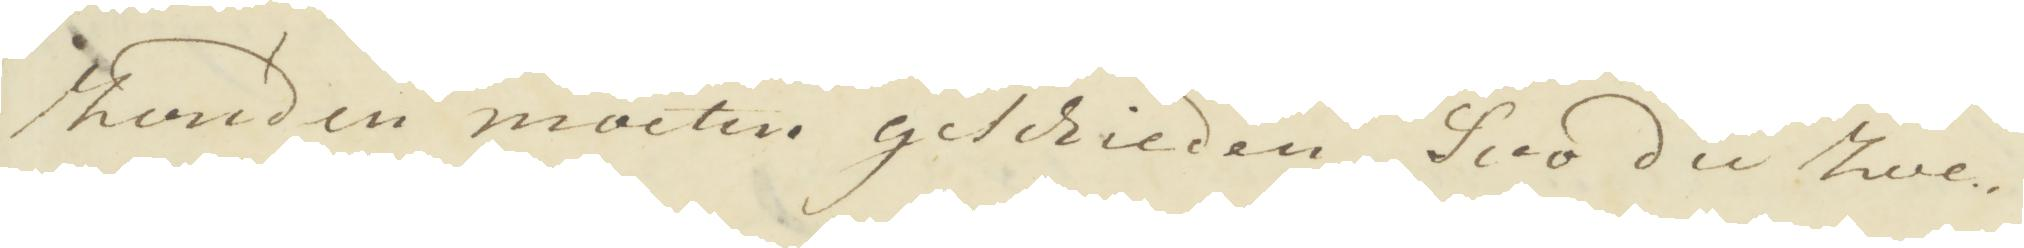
zouden moeten geschieden soo die zoe„
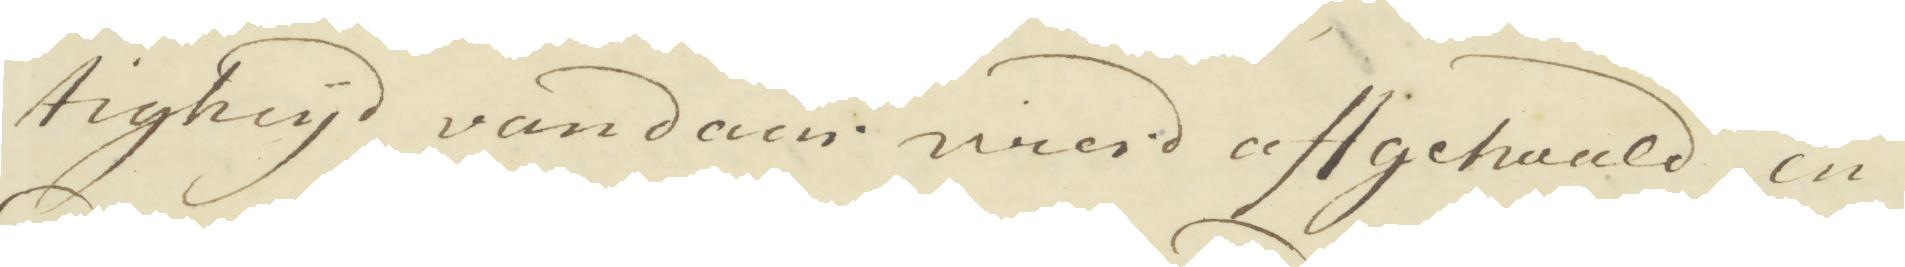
tigheijd van daar wierd affgehaald en
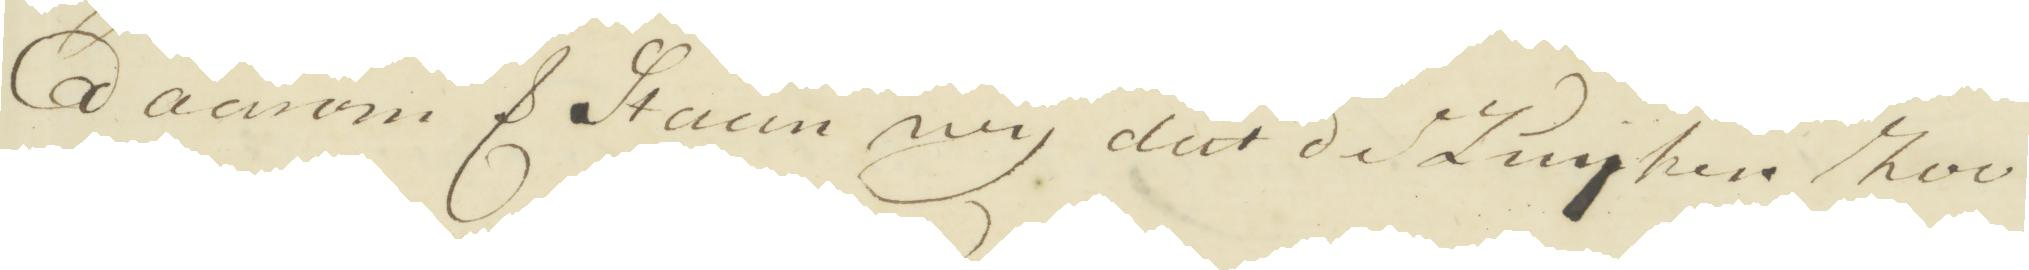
daarom verstaan wy dat de zuijker zoo
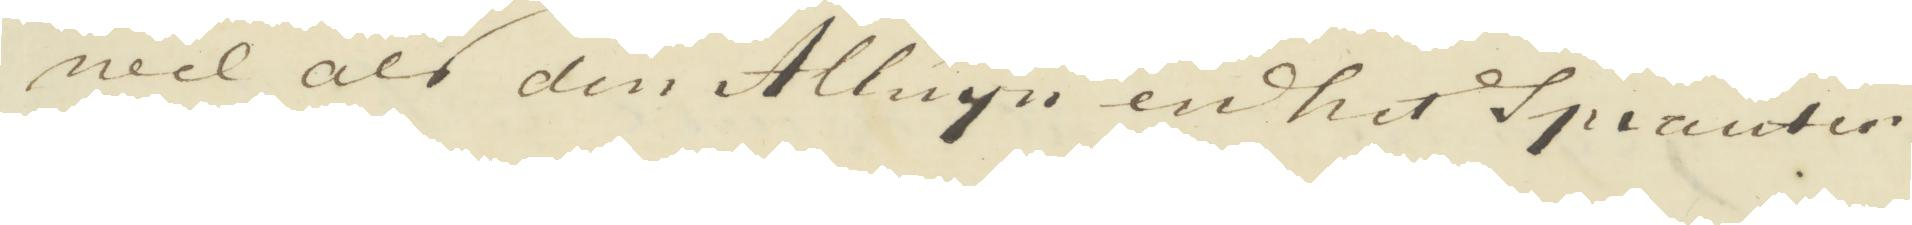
wel als den Alluijn en het spiauter
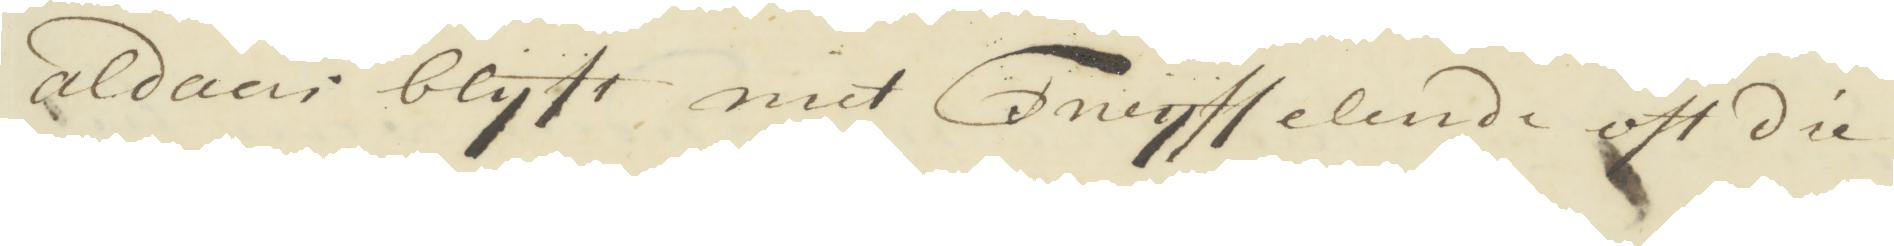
aldaar blijft niet Twijffelende off die
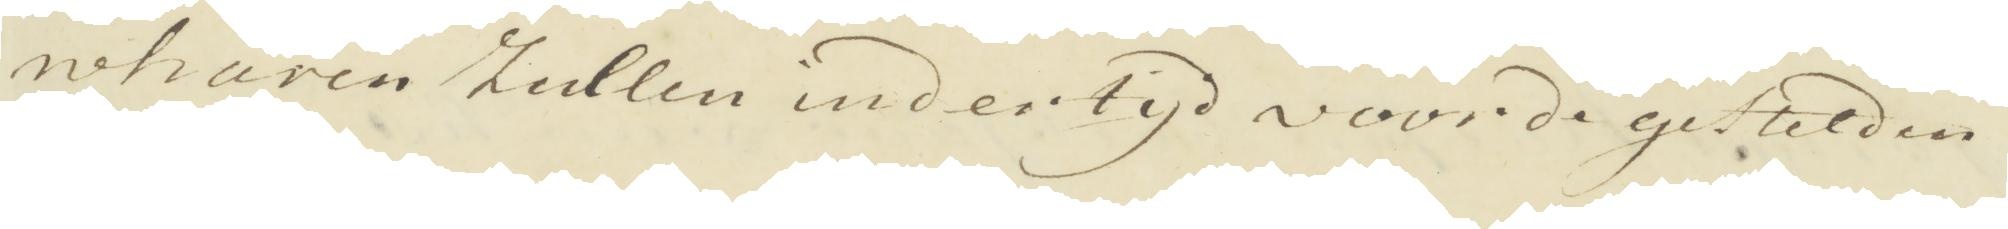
wharen zullen inder tijd voor de gestelden
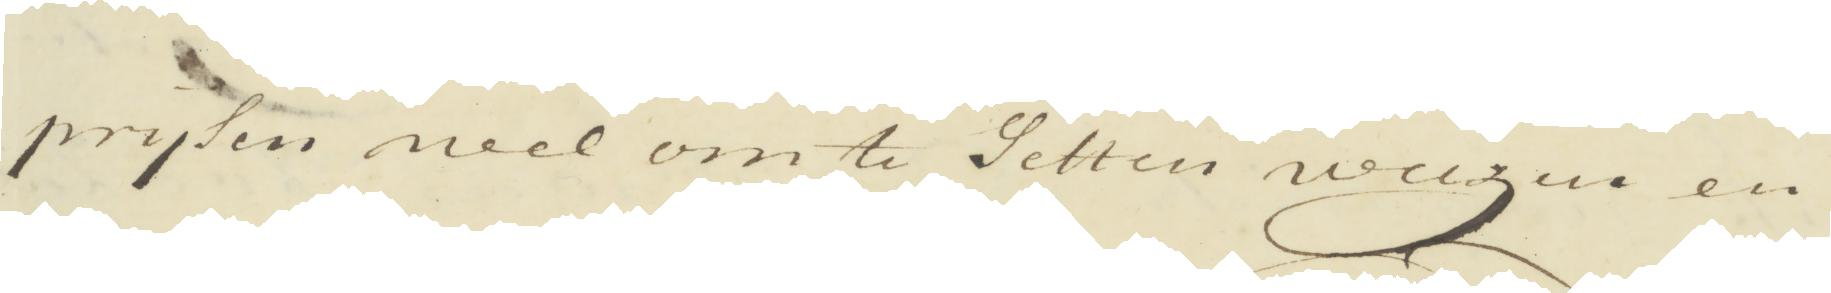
prijsen wel om te setten weezen en
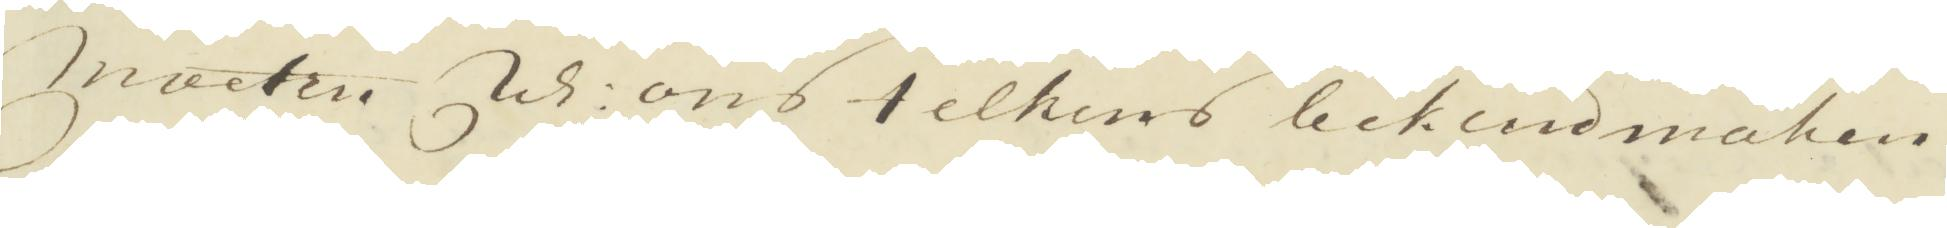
moeten UE: ons telkens bekend maken
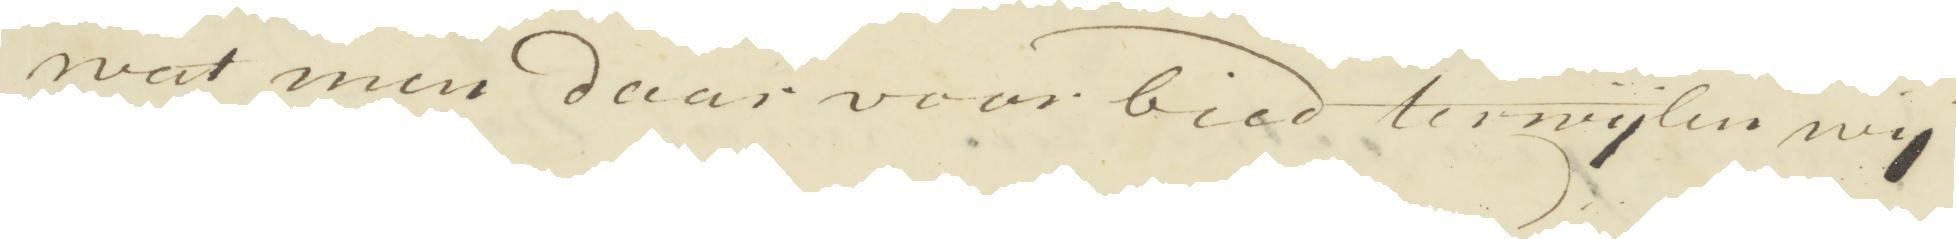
wat men daar voor bied terwijlen wij
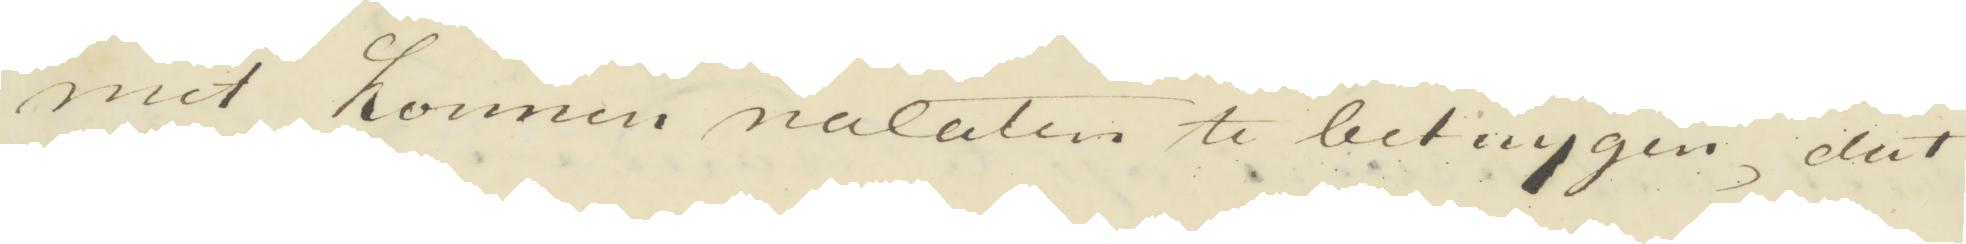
niet konnen nalaten te betuijgen, dat
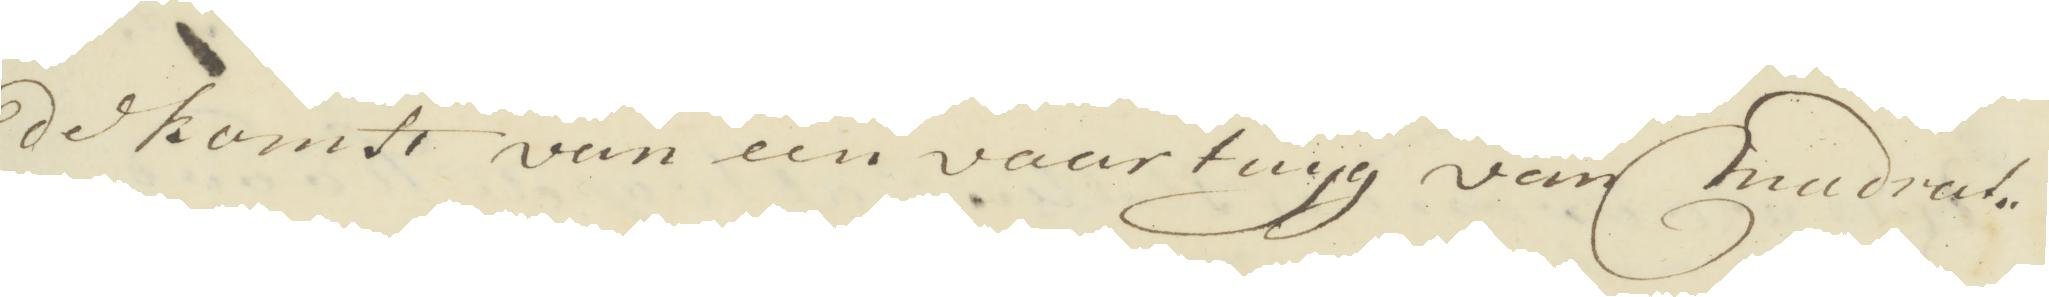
de komst van een vaartuijg van madras„
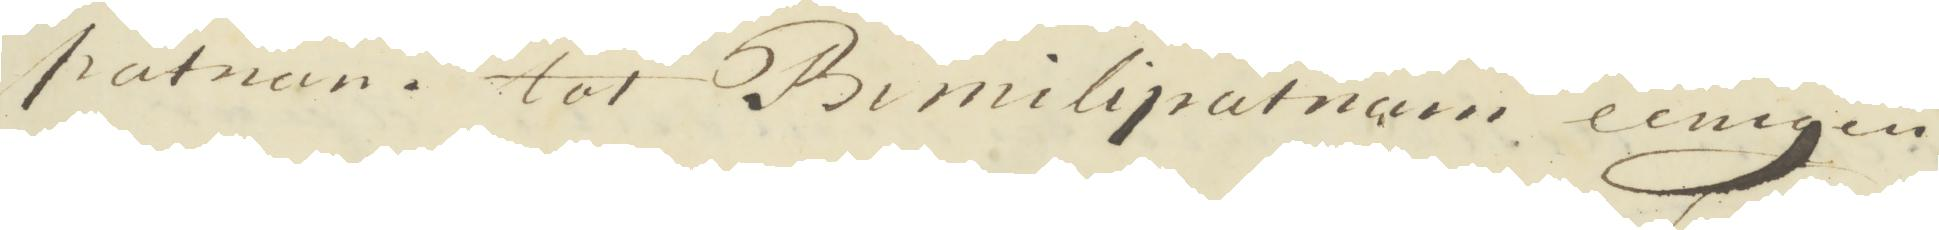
patnam tot Bimilipatnam eenigen
